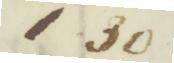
1. 30
